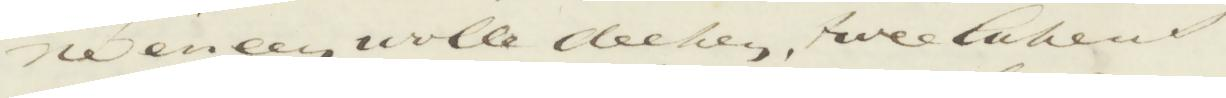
ne en een wolle deeken, twee lakens
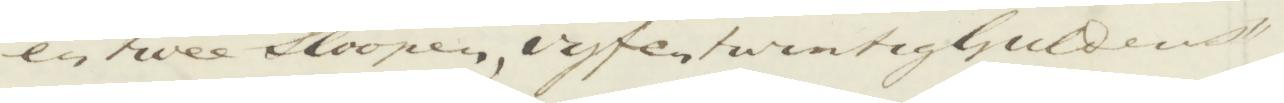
en twee sloopen, vyf en twintig Guldens„
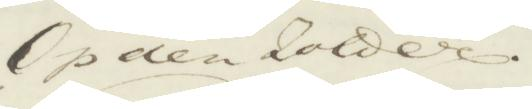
Op den zolder.
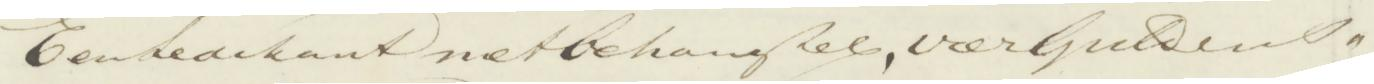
Een ledikant met behangzel, vier Guldens„
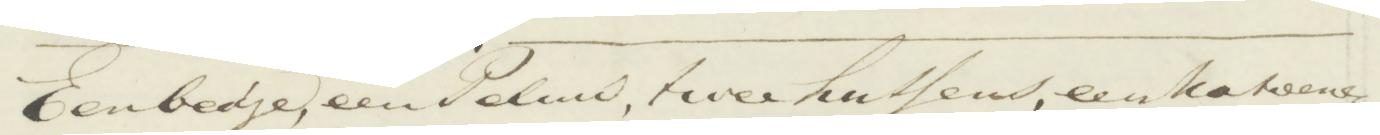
Een bedje, een Peluw, twee kussens, een katoenen
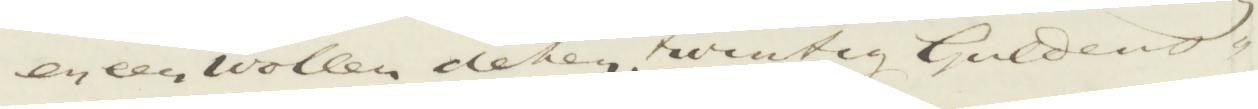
en een wollen deken, twintig Guldens „
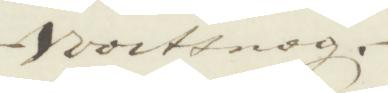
Voortsnog.
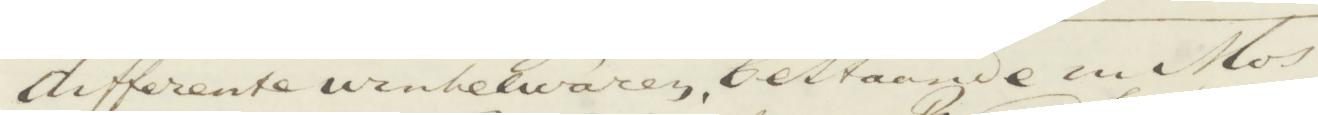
differente winkelwaren, bestaande in Mos
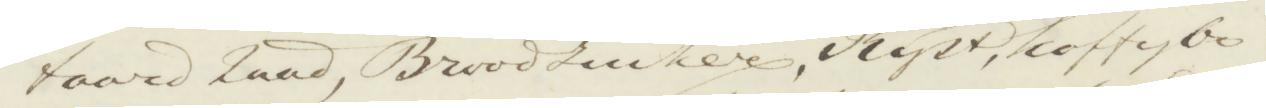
taard zaad, Broodzuiker, Ryst, koffybo
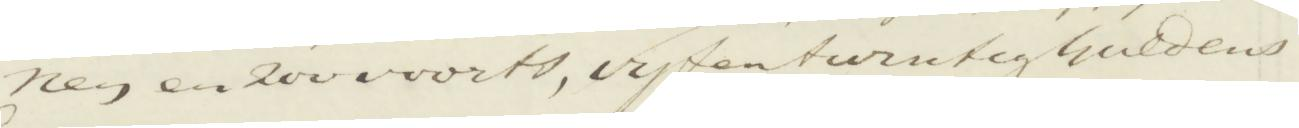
nen en zoo voorts, vyfen twintig Guldens
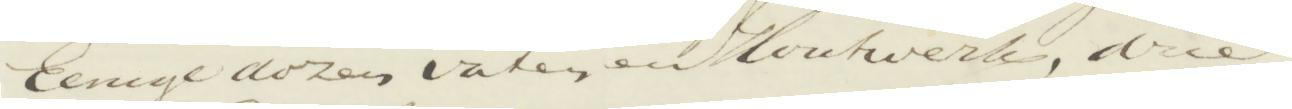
Eenige dozen vaten en Houtwerk, drie
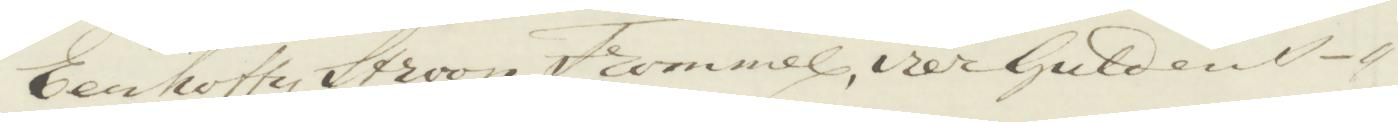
Een koffy stroop Trommel, vier Guldens -„
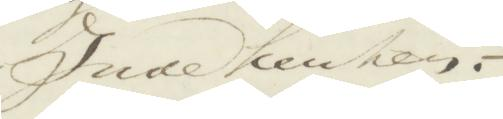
In de keuken.
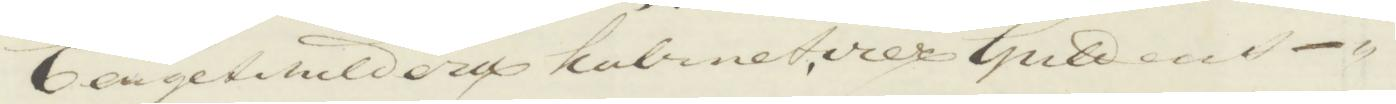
Een geschilderd kabinet, vier Guldens -„
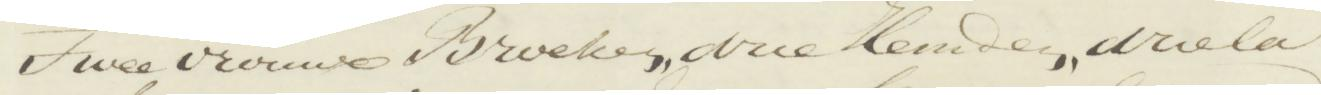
Twee vrouwe Broeken, drie hemden, drie la
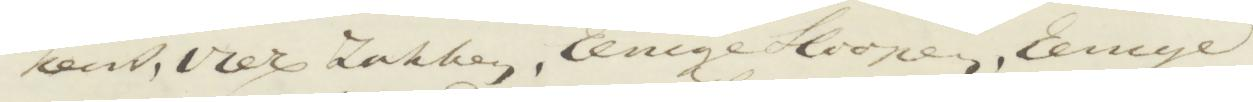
kens, vier zakken, Eenige sloopen, Eenige
